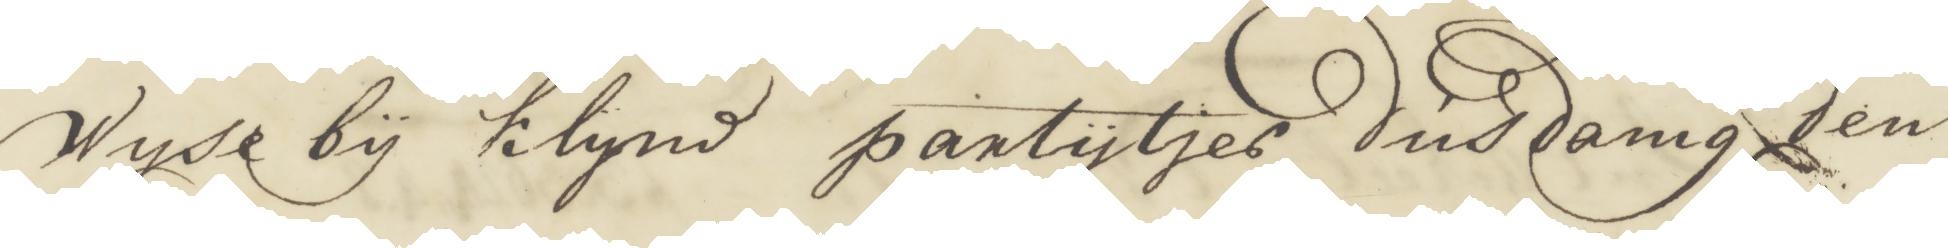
wyse bij klijne partijtjes dus danig den
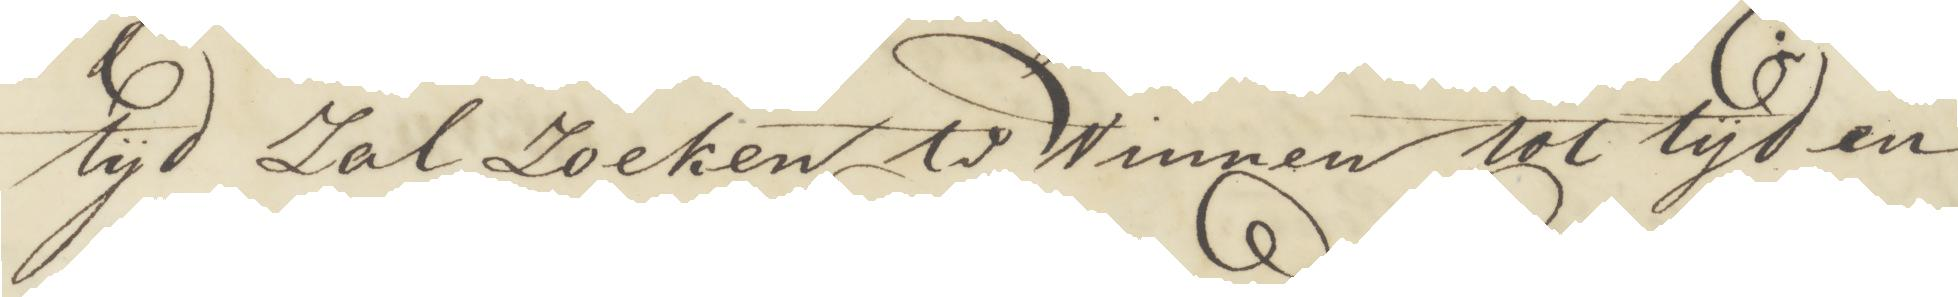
tijd zal zoeken te winnen tot tijd en
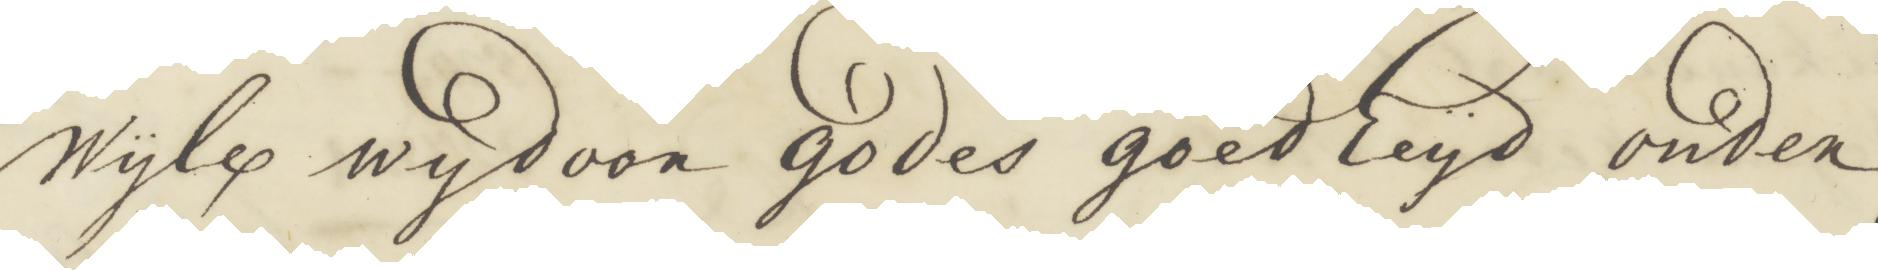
wijle wydoor godes goedheijd onder
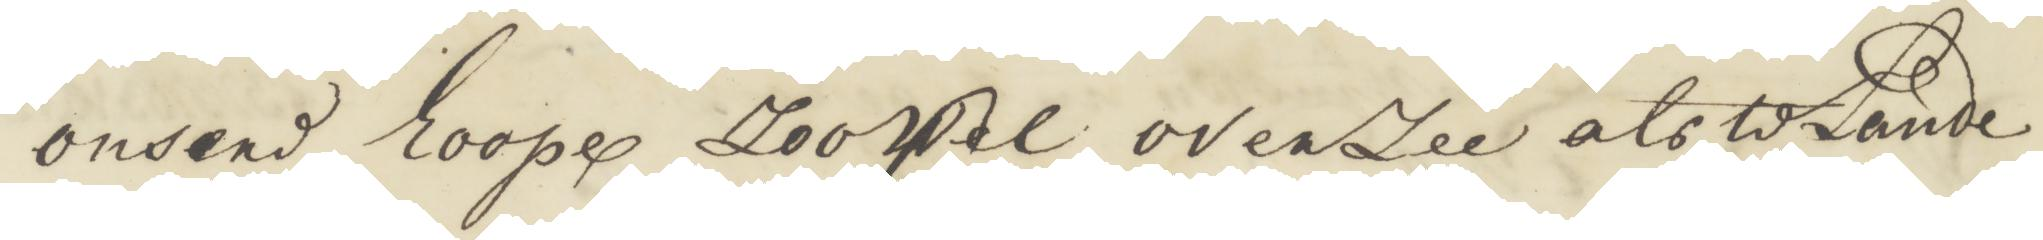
onsere hoope zoowel overzee als telande
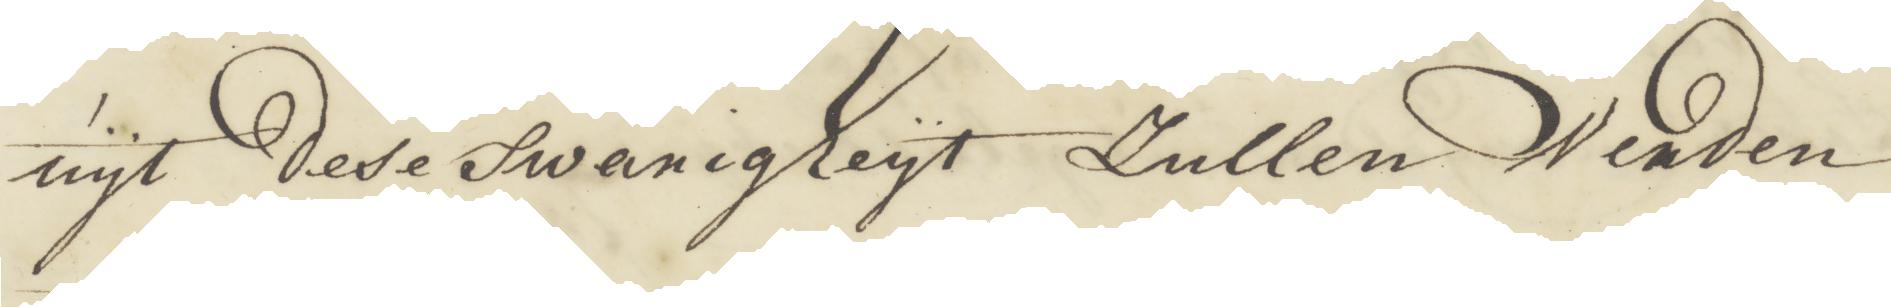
uijt dese swarigheijt zullen werden
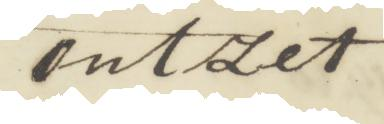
ontzet
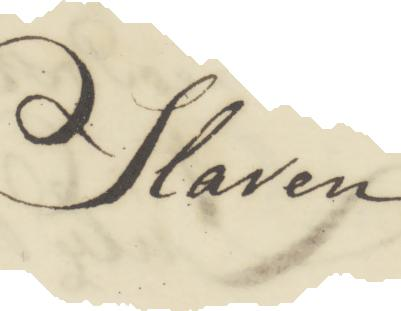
Slaven
